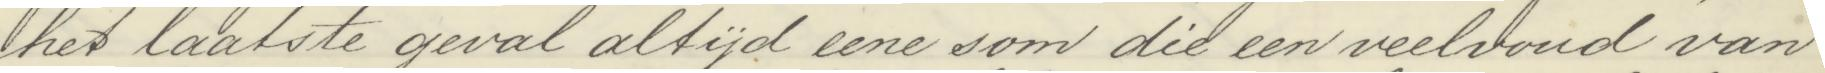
het laatste geval altijd eene som die een veelvoud van
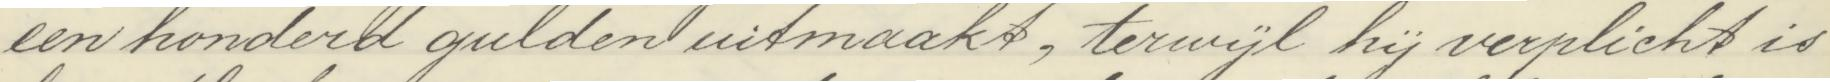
een honderd gulden uitmaakt, terwijl hij verplicht is
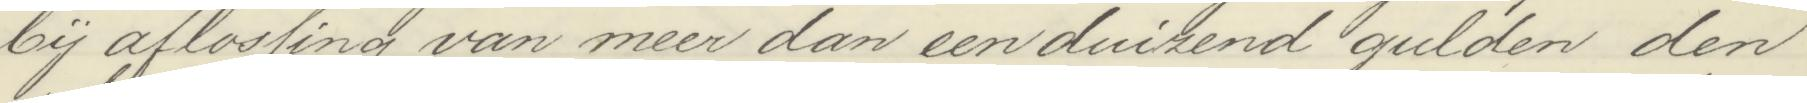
bij aflossing van meer dan een duizend gulden den
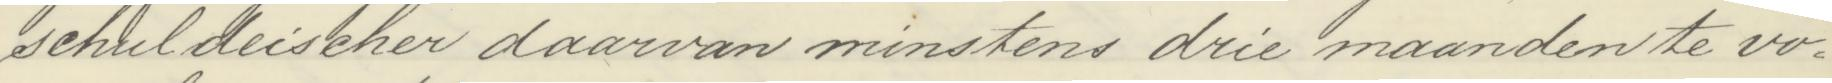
schuldeischer daarvan minstens drie maanden te vo=
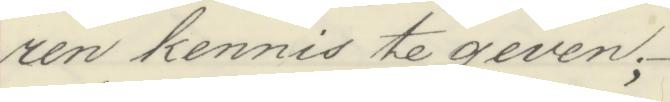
ren kennis te geven;
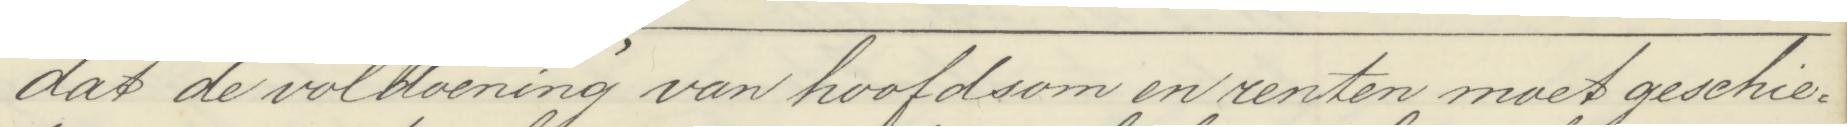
dat de voldoening van hoofdsom en renten moet geschie=
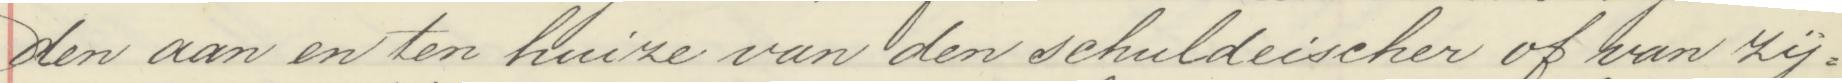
den aan en ten huize van den schuldeischer of van zij=
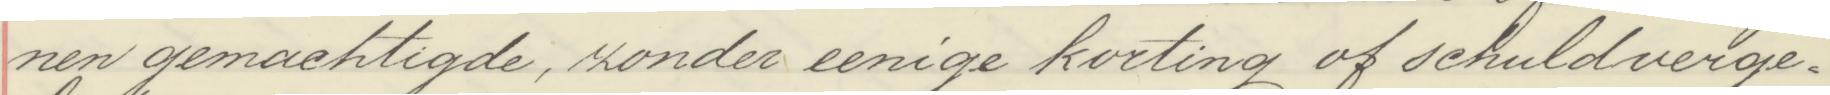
nen gemachtigde, zonder eenige korting of schuldverge=
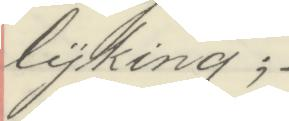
lijking;
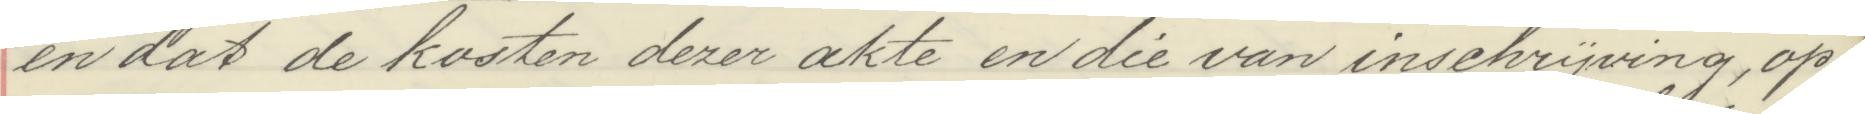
en dat de kosten dezer akte en die van inschrijving, op=
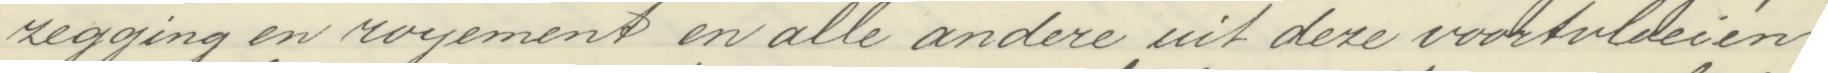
zegging en royement en alle andere uit deze voortvloeien=
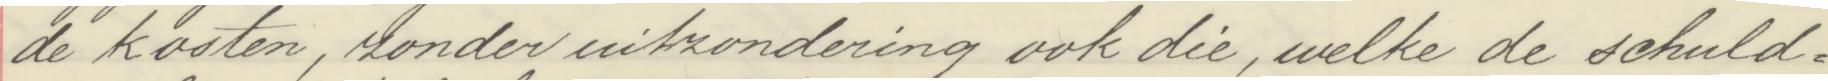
de kosten, zonder uitzondering ook die, welke de schuld=
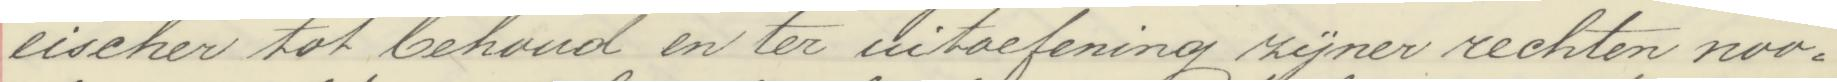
eischer tot behoud en ter uitoefening zijner rechten noo=
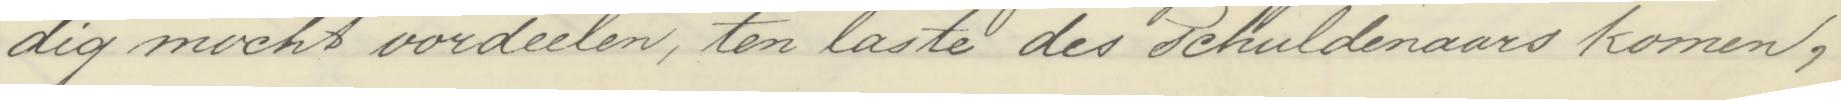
dig mocht oordeelen, ten laste des schuldenaars komen,
